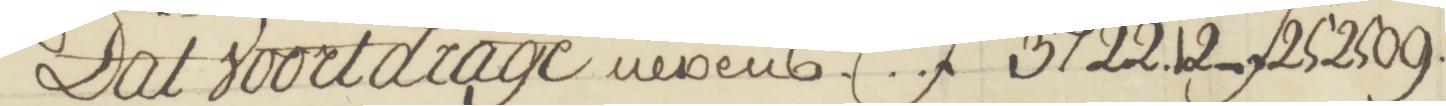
Dat voortdrage nevens . . . ƒ 3722.12. – ƒ252509
